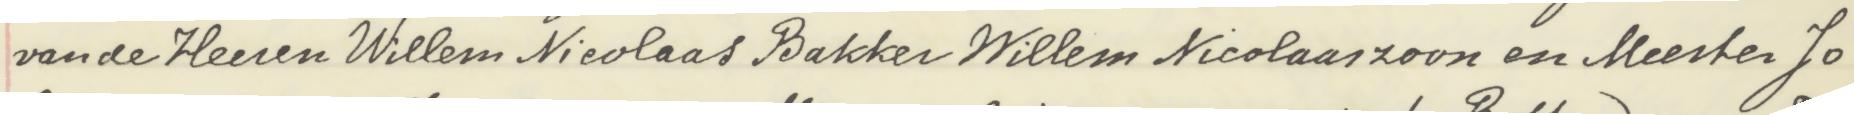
van de Heeren Willem Nicolaas Bakker Willem Nicolaaszoon en Meester Jo
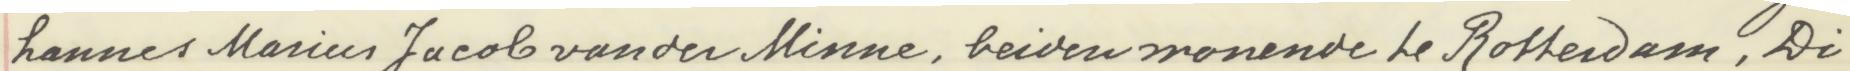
hannes Marius Jacob van der Minne, beiden wonende te Rotterdam, Di
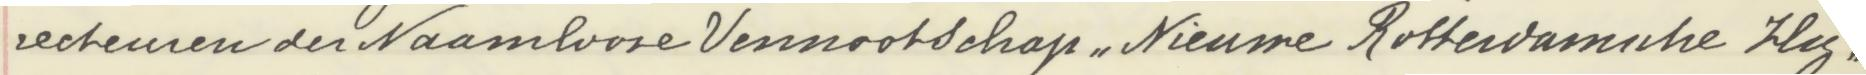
recteuren der Naamlooze Vennootschap, Nieuwe Rotterdamsche Hy„
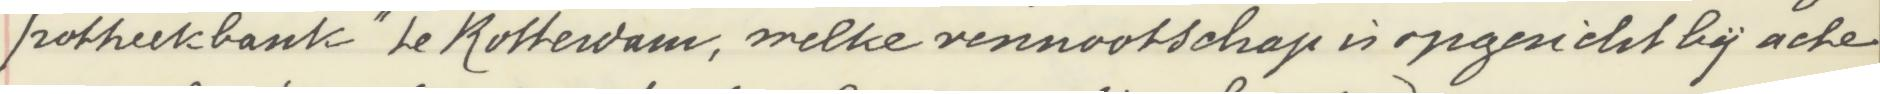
potheekbank te Rotterdam, welke vennootschap is opgericht bij acte
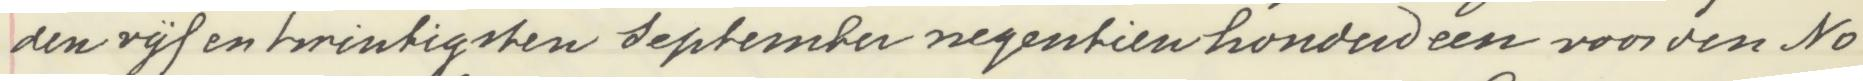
den vijf en twintigsten september negentien honderd een voor den No
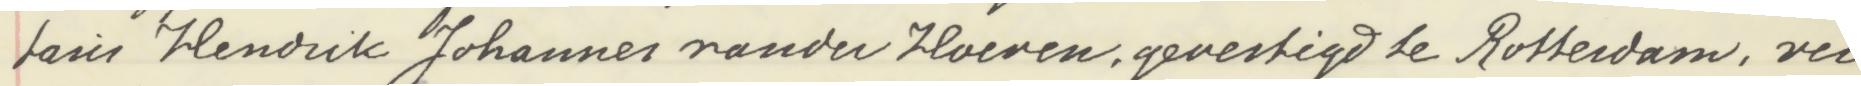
taris Hendrik Johannes vander Hoeven, gevestigd te Rotterdam, ver
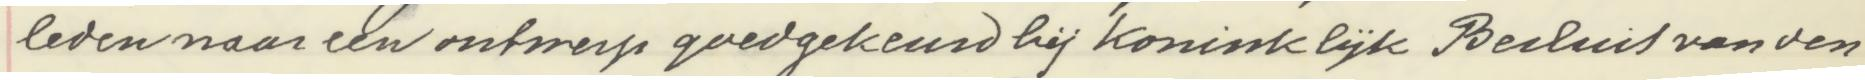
leden naar een ontwerp goedgekeurd bij koninklijk Besluit van den
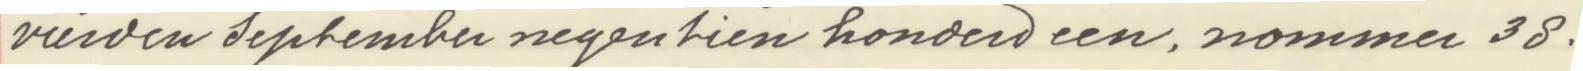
vierden september negentien honderd een, nommer 38.
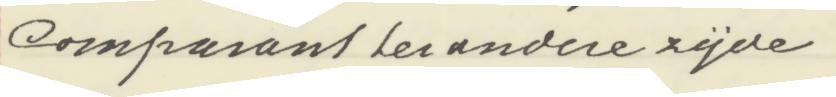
Comparant ter andere zijde
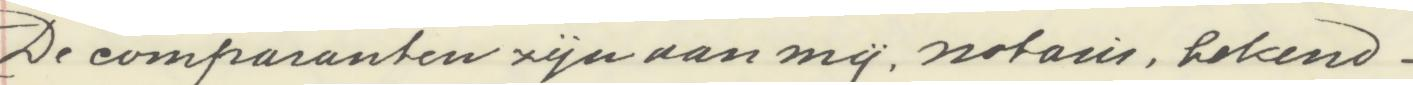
De comparanten zijn aan mij notaris, bekend
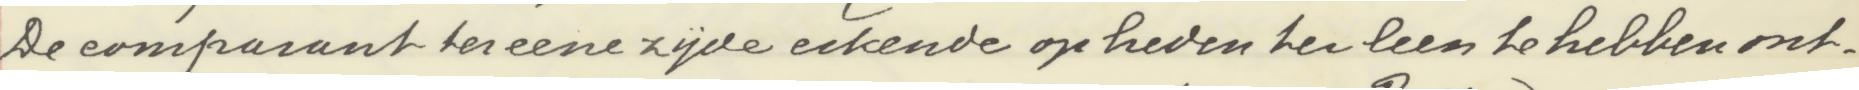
De comparant ter eene zijde erkende op heden ter leen te hebben ont„
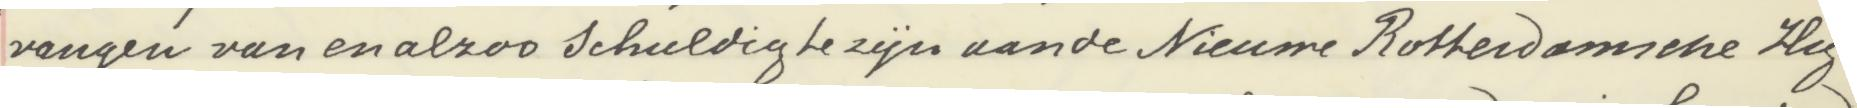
vangen van en alzoo schuldig te zijn aan de Nieuwe Rotterdamsche Hy
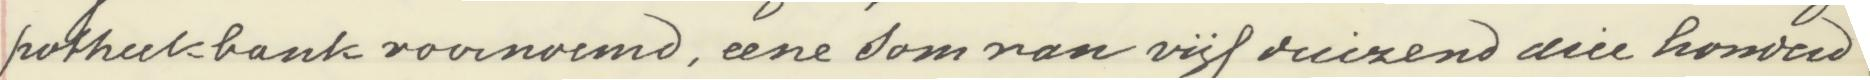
potheekbank voornoemd, eene som van vijf duizend drie honderd
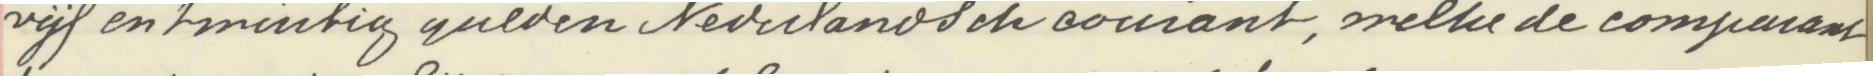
vijf en twintig gulden Nederlandsch courant, welke de comparant
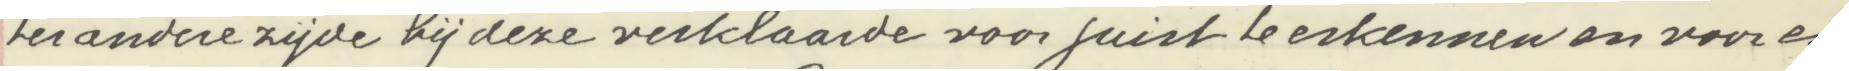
ter andere zijde bij deze verklaarde voor juist te erkennen en voor en
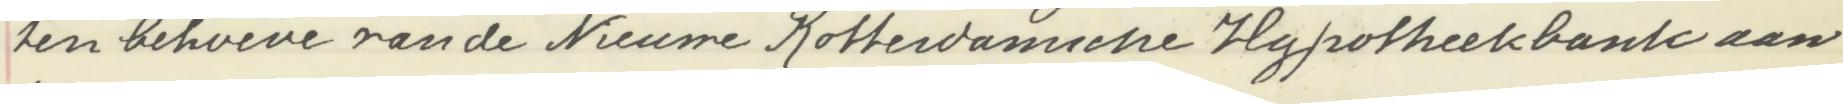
ten behoeve van de Nieuwe Rotterdamsche Hypotheekbank aan
